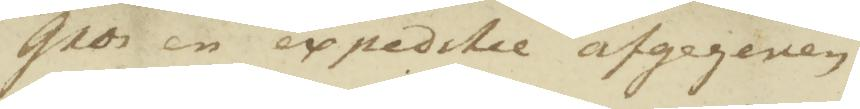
Gros en expeditie afgegeven
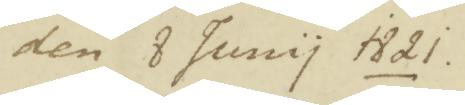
den 8 Junij 1821.
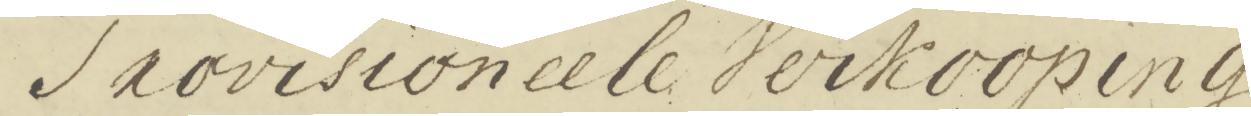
Provisioneele Verkooping
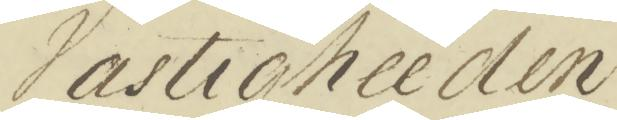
Vastigheeden
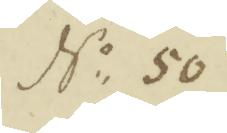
N„o 50
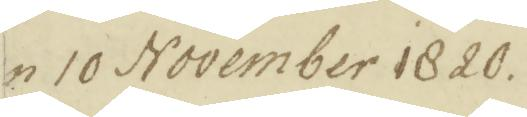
n 10 November 1820.
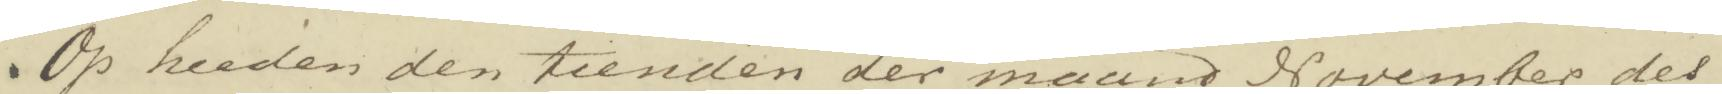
Op heeden den tienden der maand November des
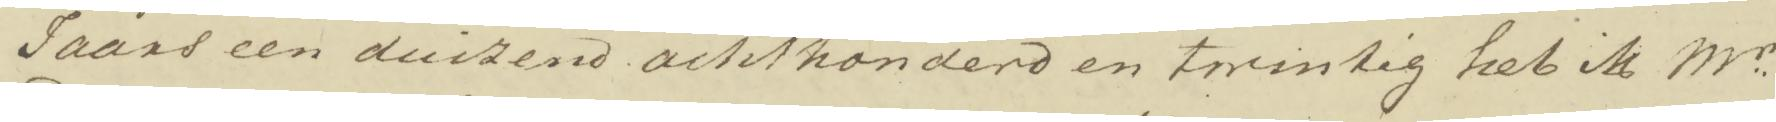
Iaars een duizend achthonderd en twintig heb ik M:r
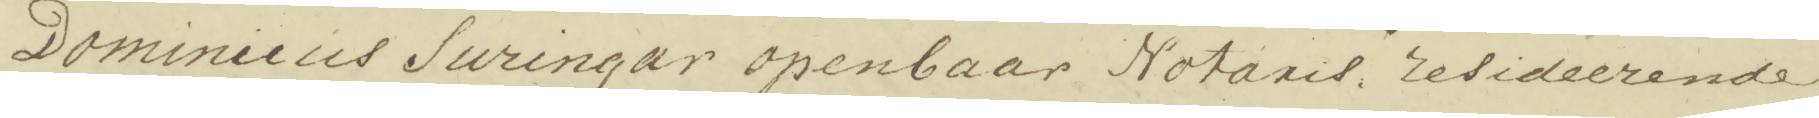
Dominicus Suringar openbaar Notaris, resideerende
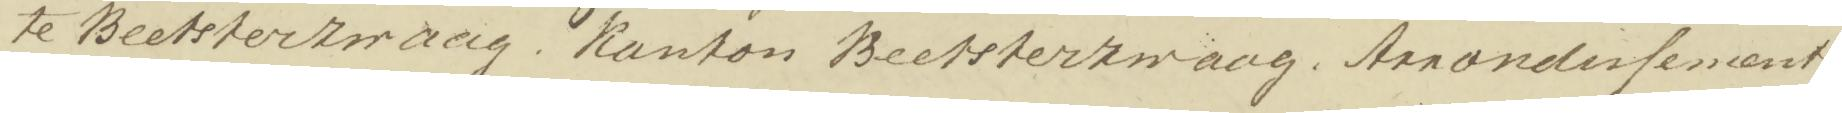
te Beetsterzwaag, Kanton Beetsterzwaag, Arrondissement
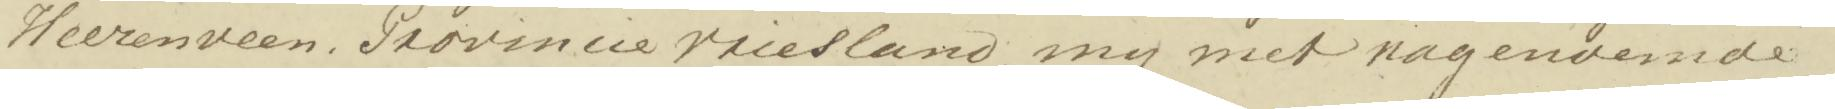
Heerenveen, Provincie vriesland, my met nagenoemde
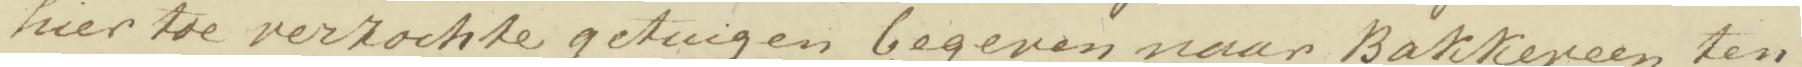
hier toe verzochte getuigen begeven naar Bakkeveen ten
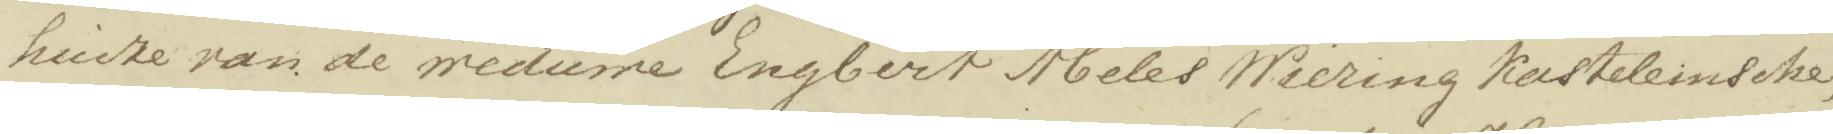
huize van de weduwe Engbert Abeles Wiering Kasteleinsche,
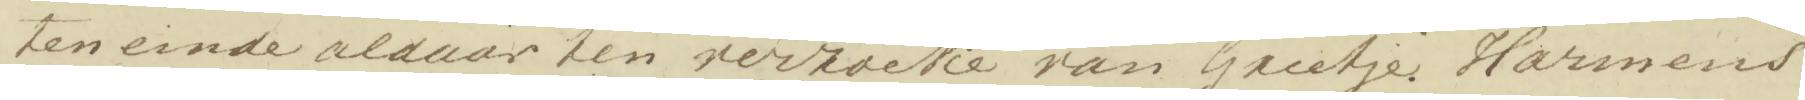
ten einde aldaar ten verzoeke van Grietje Harmens
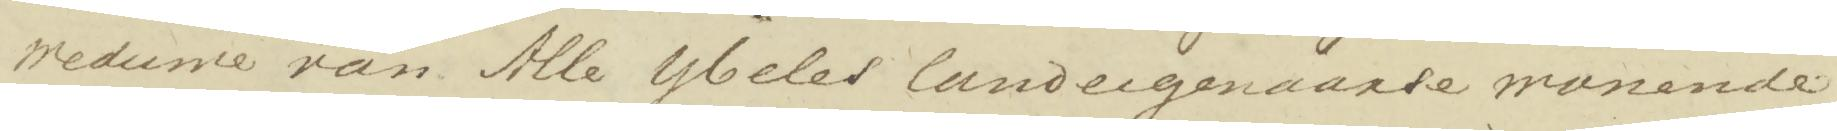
weduwe van Alle Ybeles landeigenaarse wonende
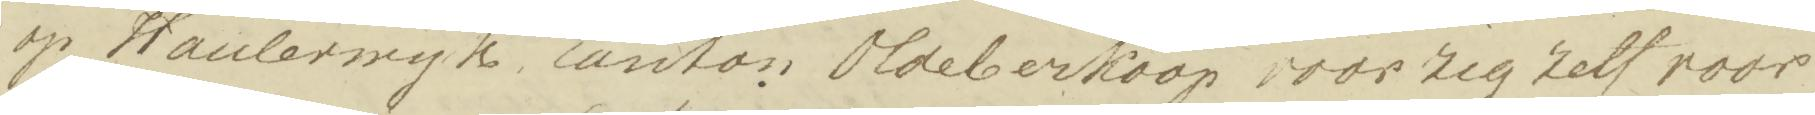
op Haulerwijk, canton Oldeberkoop voor zig zelf voor
